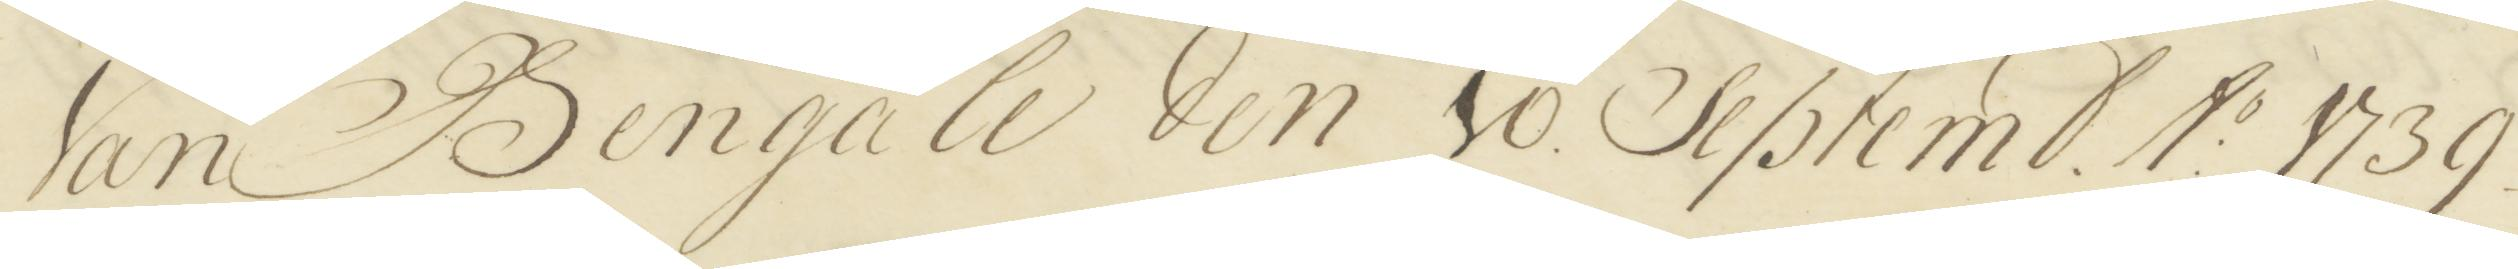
Van Bengale den 10. Septemb: A:o 1739
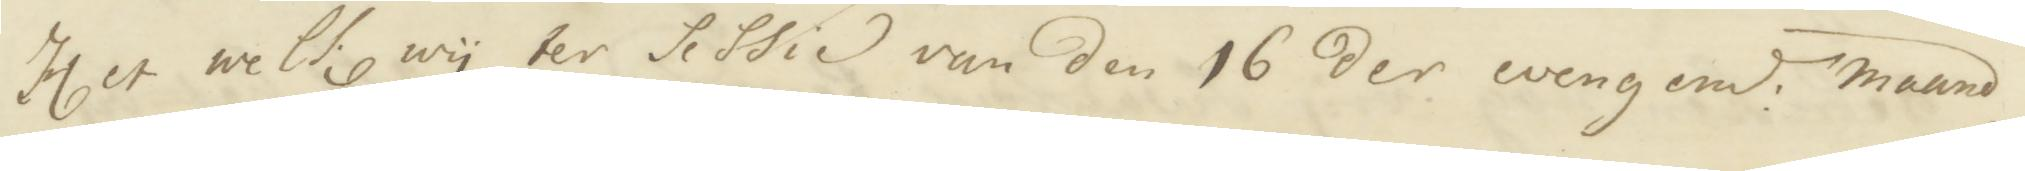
Het welk wij ter sessie van den 16 der evengem: maand
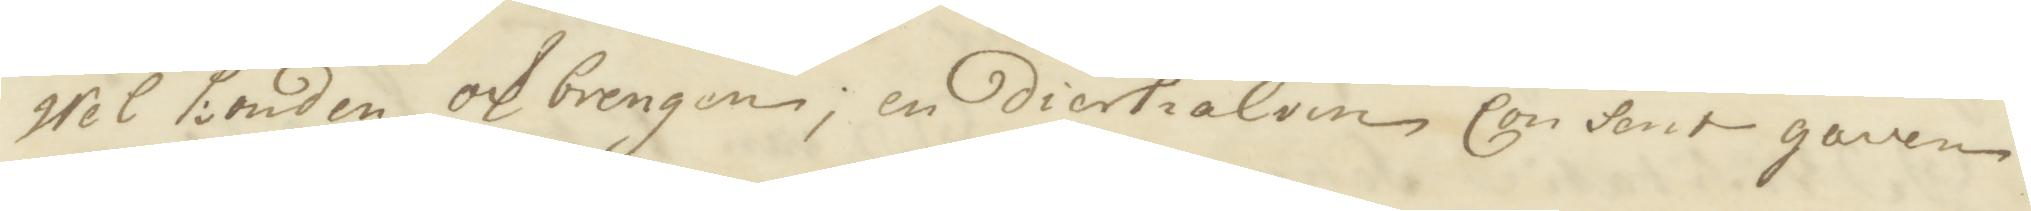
wel konden overbrengen; en dierhalven Consent gaven
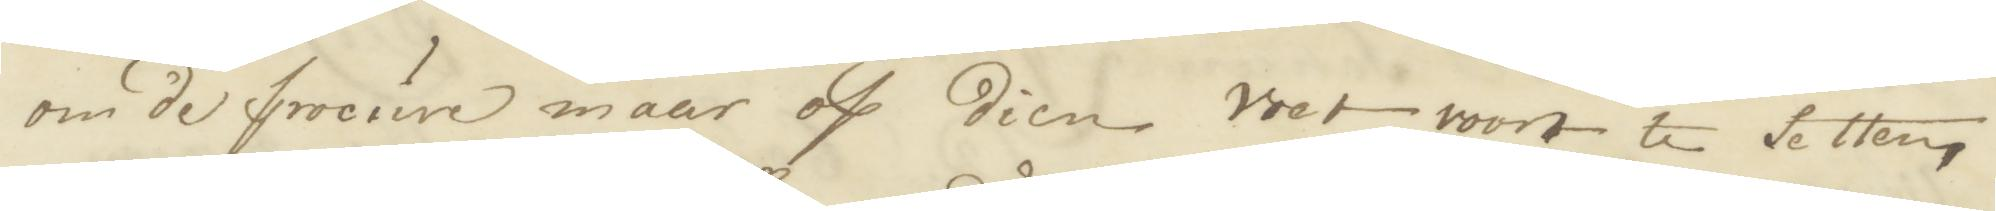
om de procure maar op dien voet voort te setten
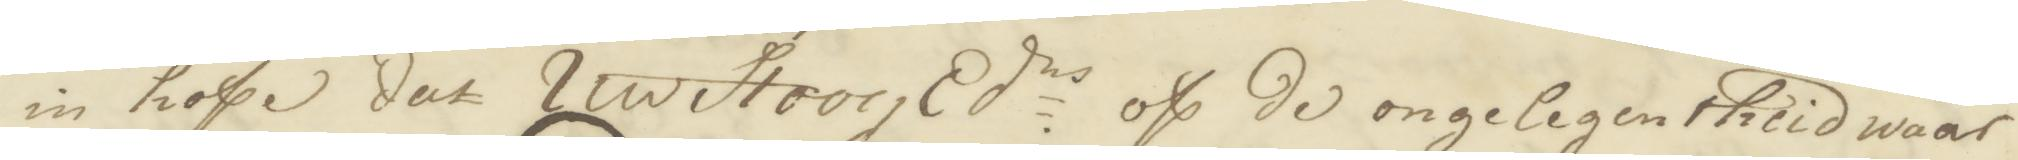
in hope dat Uw Hoog Ed=ns op de ongelegentheid waar
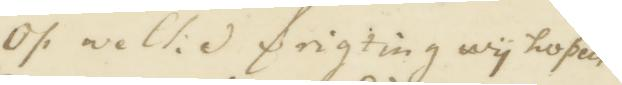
op welke verigting wij hopen
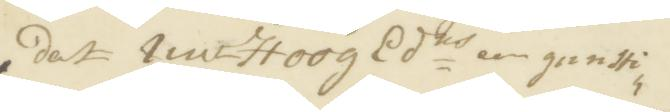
dat uw Hoog Ed=ns een gunsti„
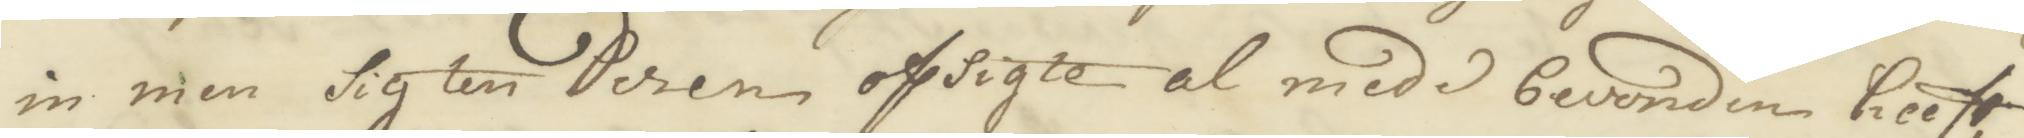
in men sig ten dezen opsigte al mede bevonden heeft,
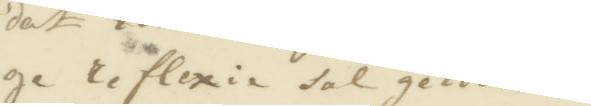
ge reflexie sal gelieven
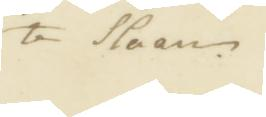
te slaan.
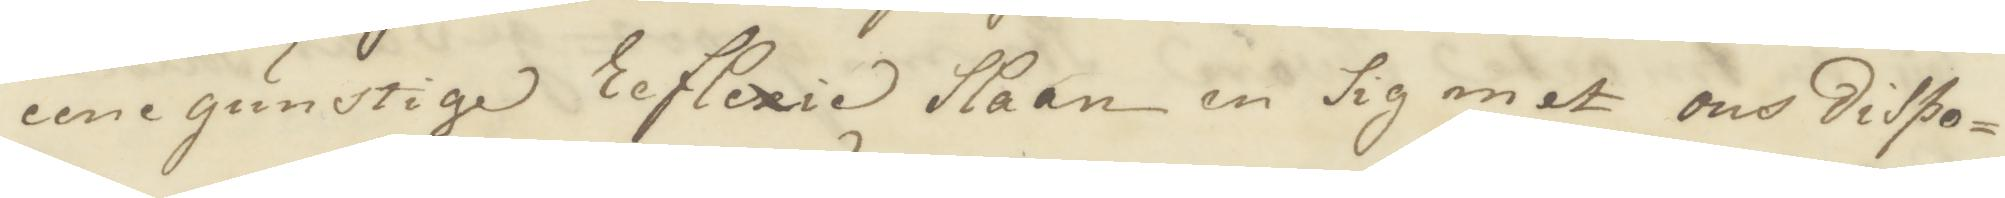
eene gunstige reflexie slaan en sig met ons dispo=
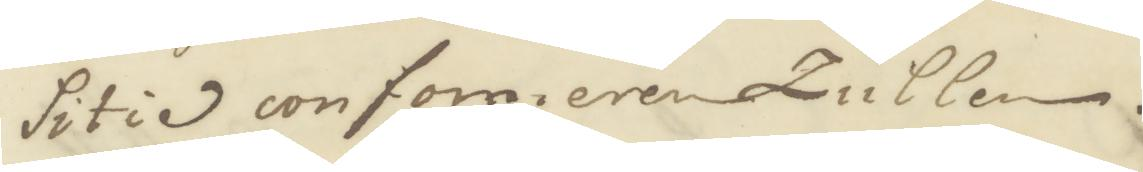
sitie conformeren zullen.
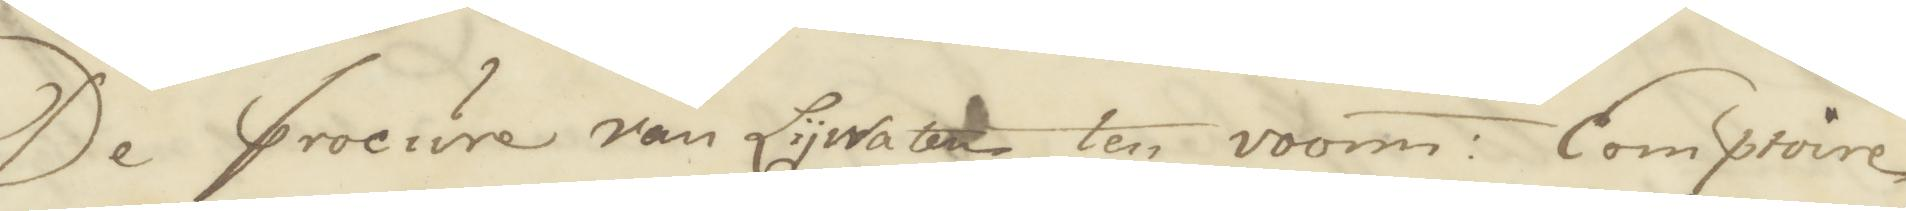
De procure van Lijwaten ten voorm: Comptoire
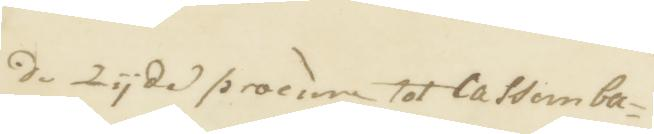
de zijde procure tot Cassemba=
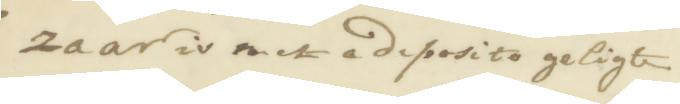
zaar is met a deposito geligte
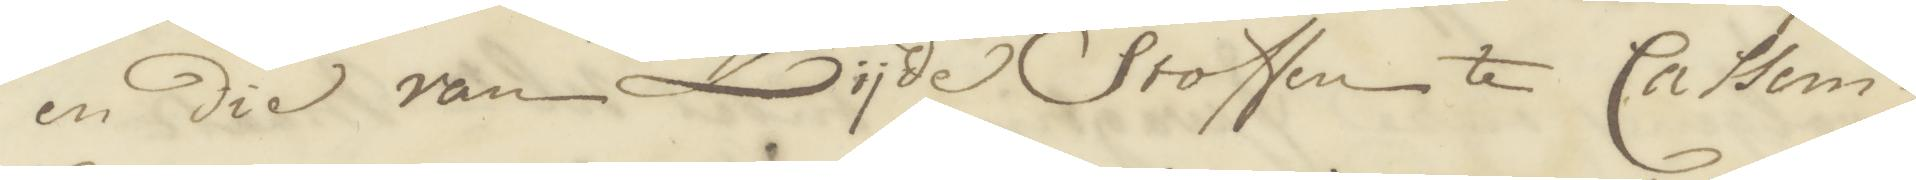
en die van Zijde Stoffen te Cassem=
